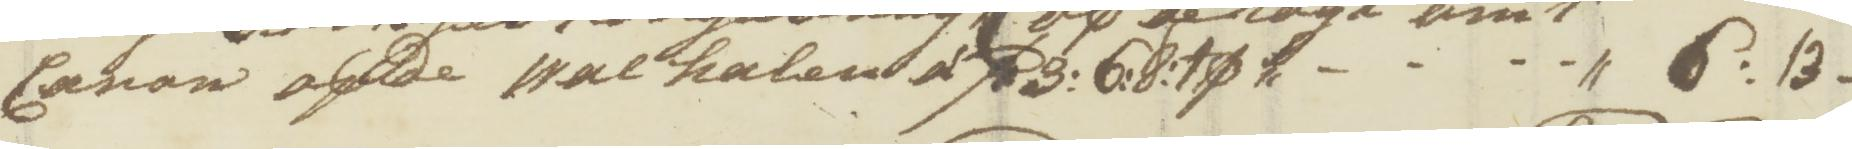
Canon op de wal halens ƒ 3: 6: 8: t p=s „ 6: 13 —
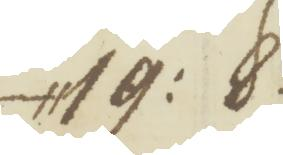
„ 19: 8 —
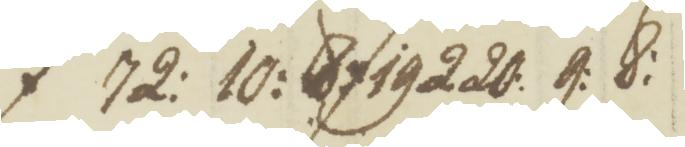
ƒ 72: 10: 8 ƒ 19220: 9: 8:
